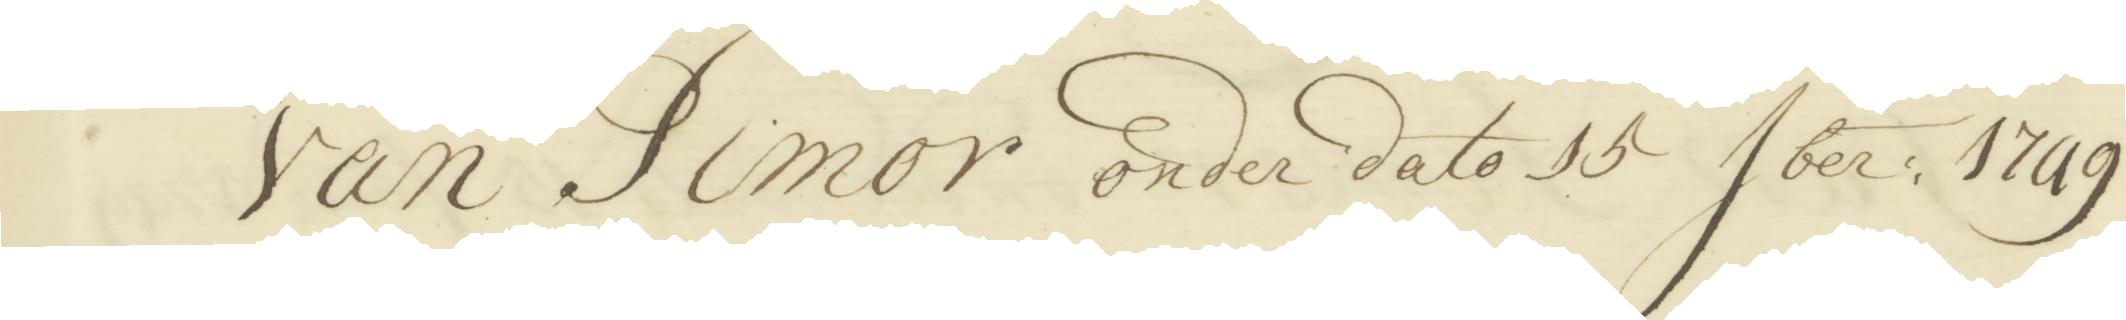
Van Timor onder dato 15 Jber: 1749
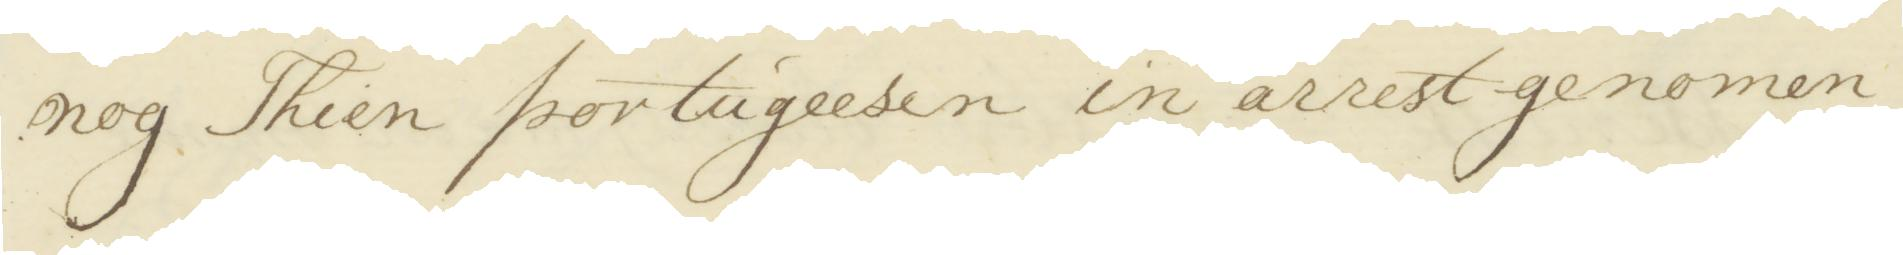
nog Thien portugeesen in arrest genomen
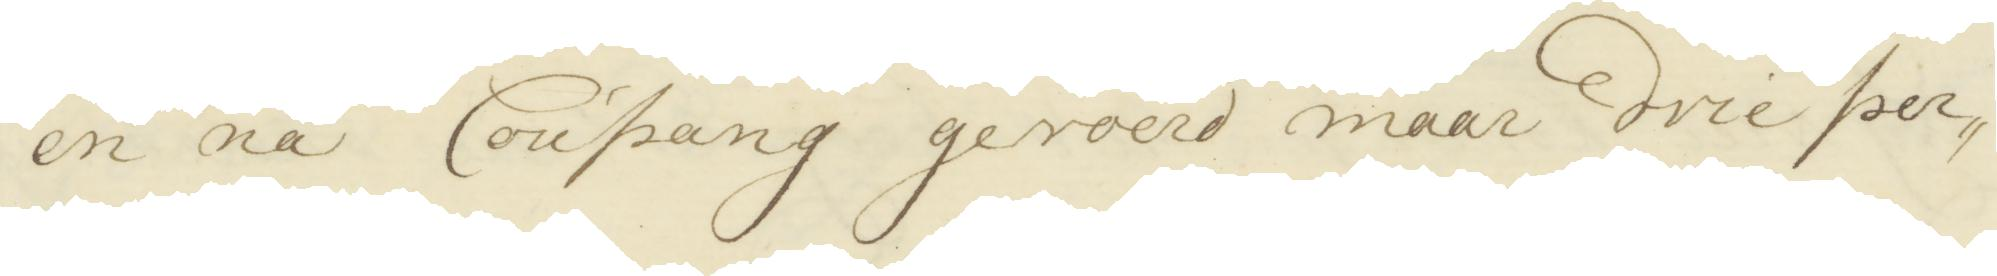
en na Coupang gevoerd maar drie per„
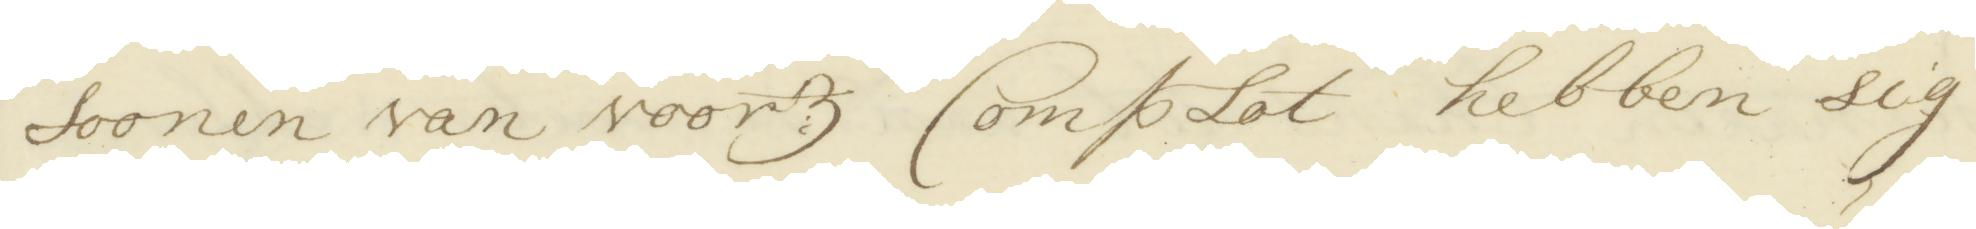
soonen van voorz: Complot hebben sig
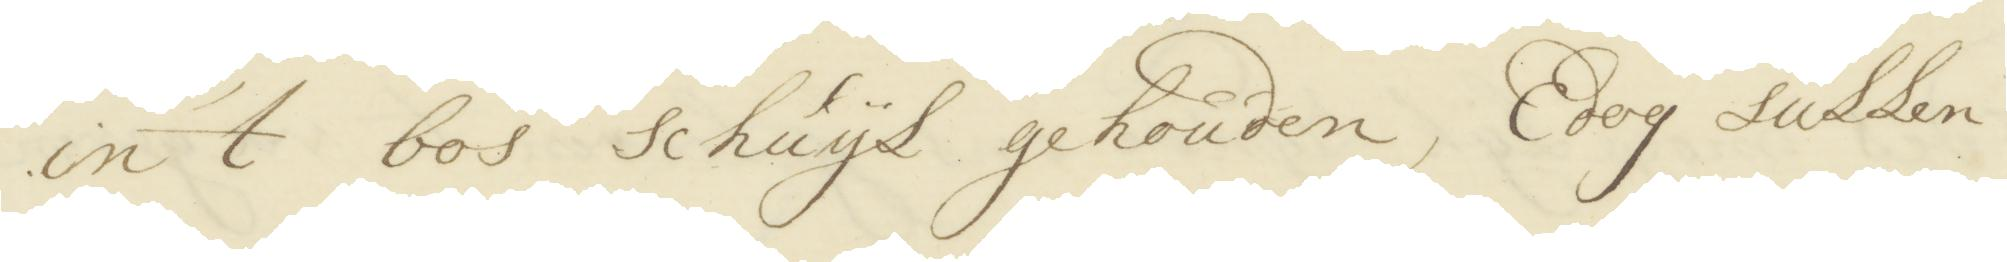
in ’t bos schuijl gehouden, Edog sullen
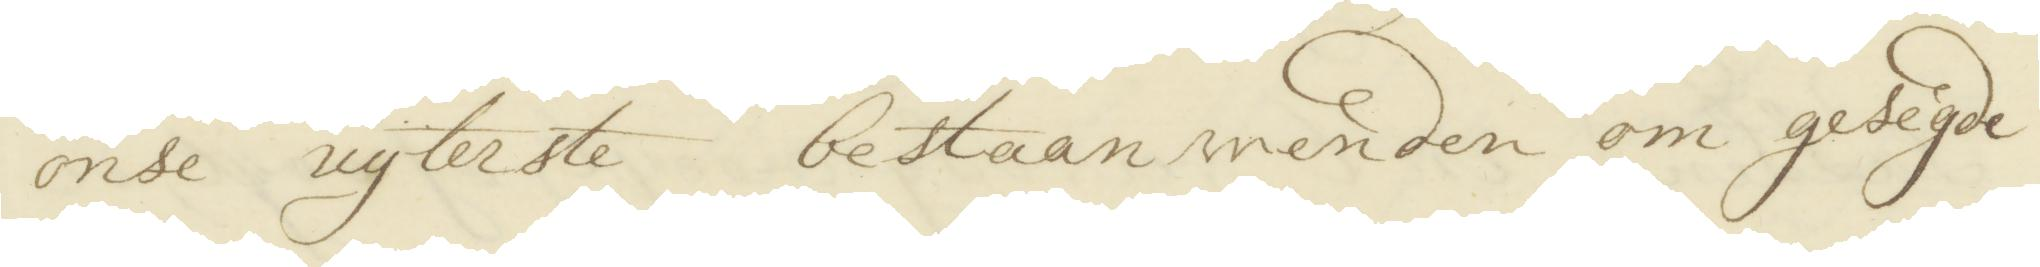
onse uijterste bestaan wenden om gesegde
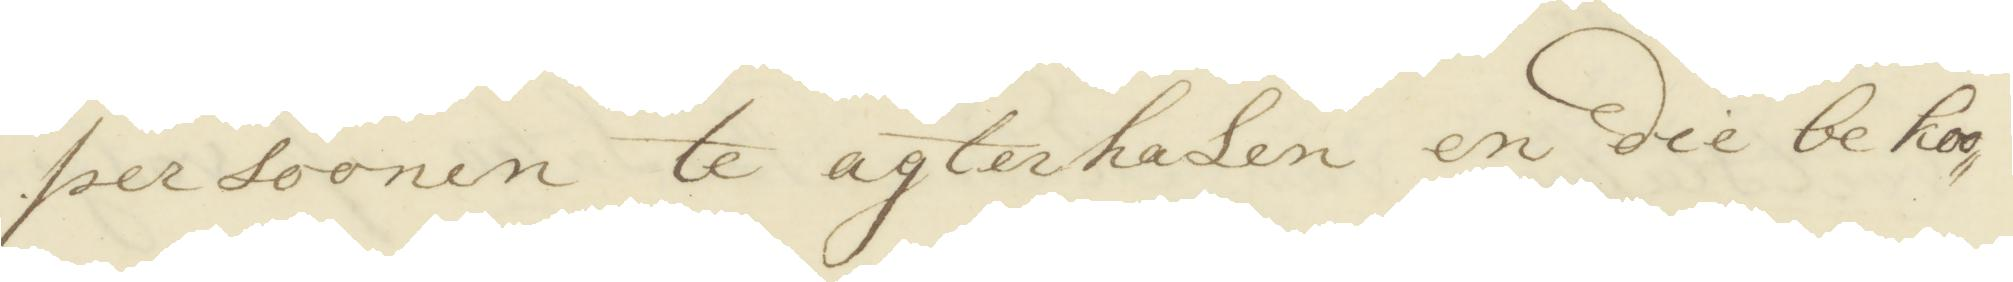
persoonen te agterhalen en die bekoo„
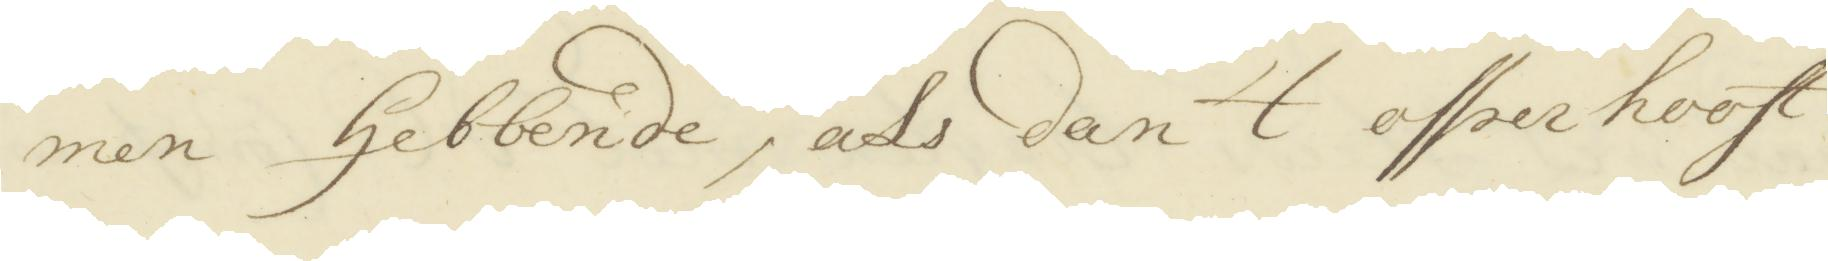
men hebbende, als dan ’t opperhooft
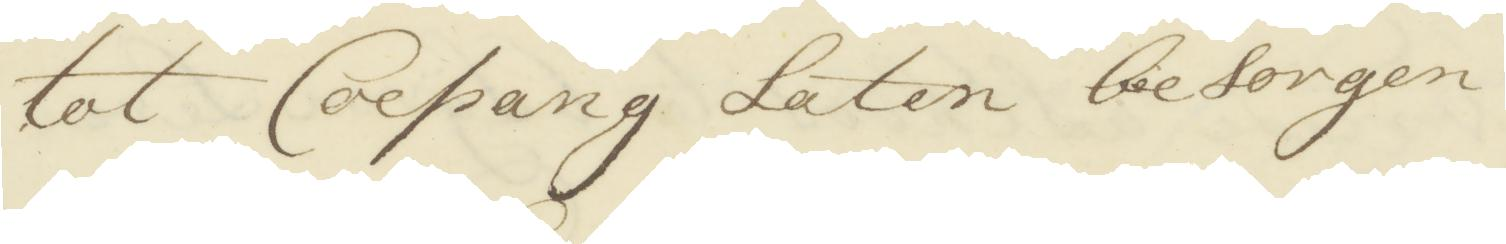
tot Coepang laten besorgen
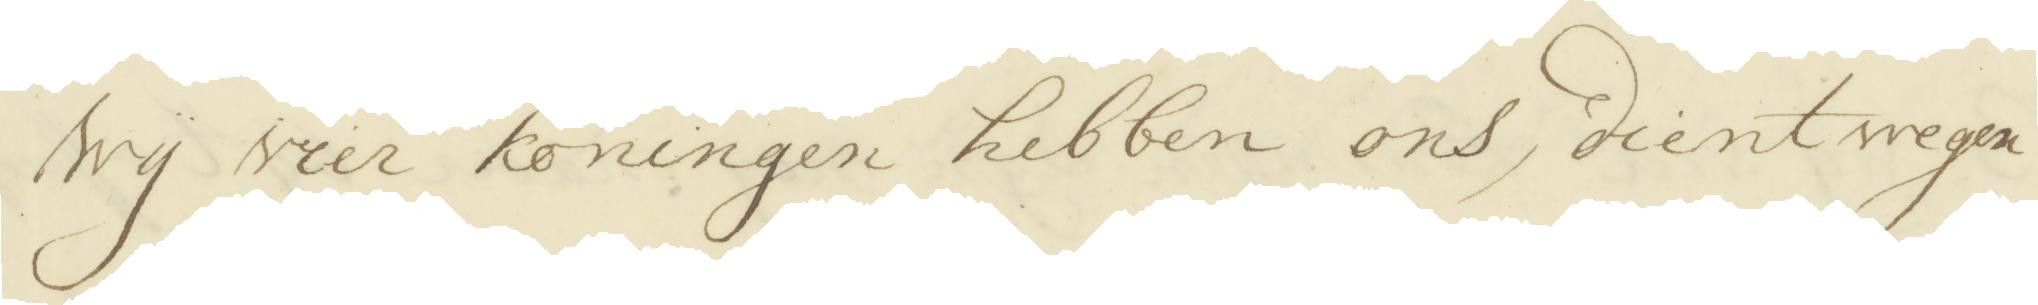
wij vier koningen hebben ons, dient wegen
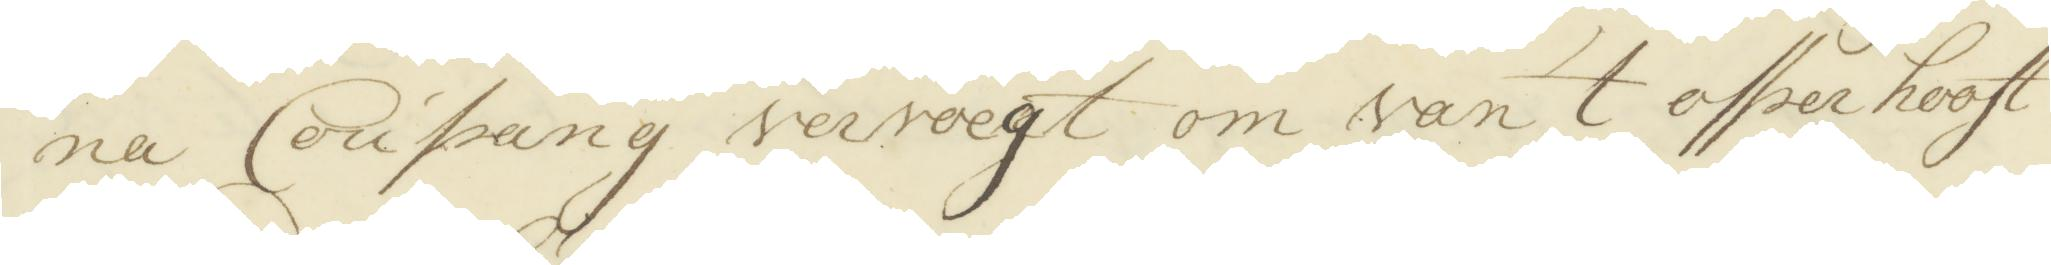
na Coupang vervoegt om van ’t opperhooft
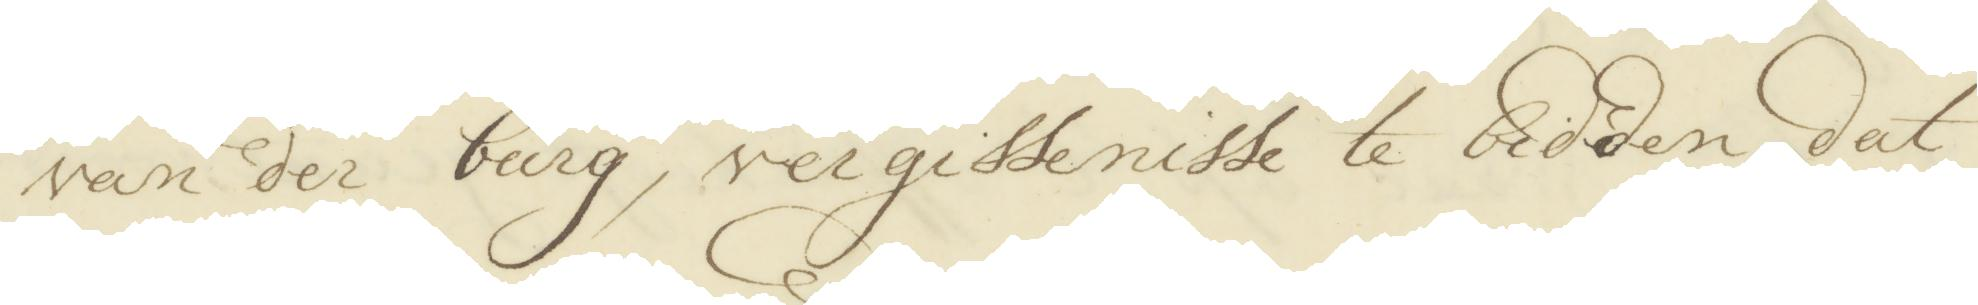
van der burg, vergissenisse te bidden, dat
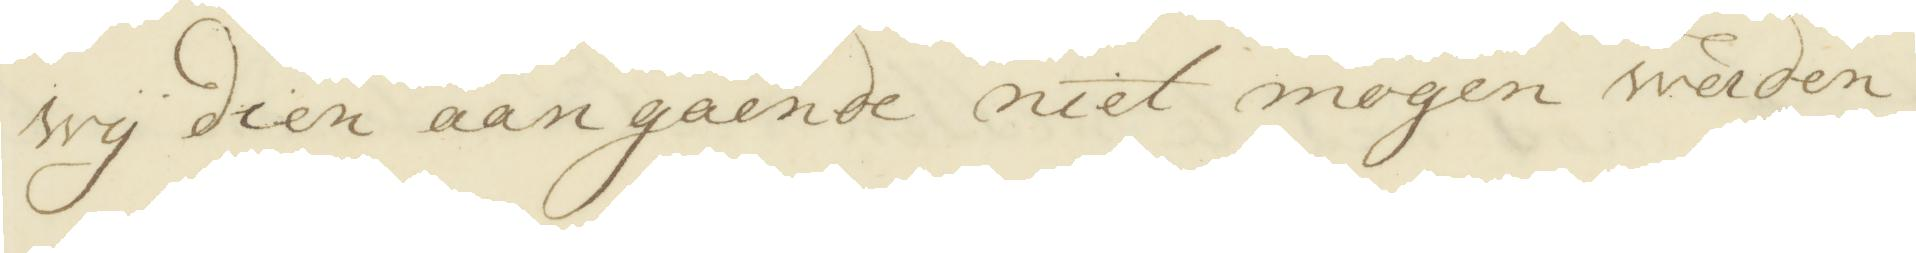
wij dien aangaende niet mogen werden
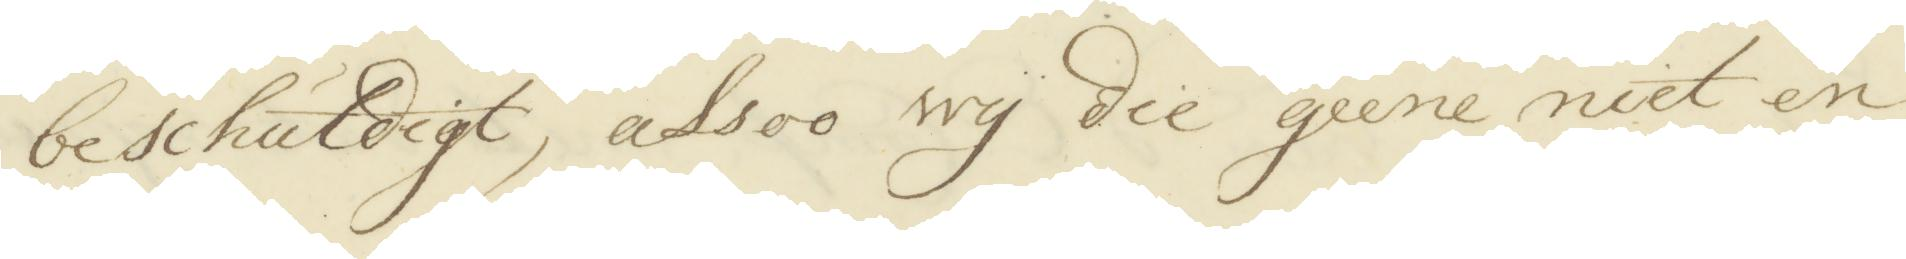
beschuldigt, alsoo wij die geene niet en
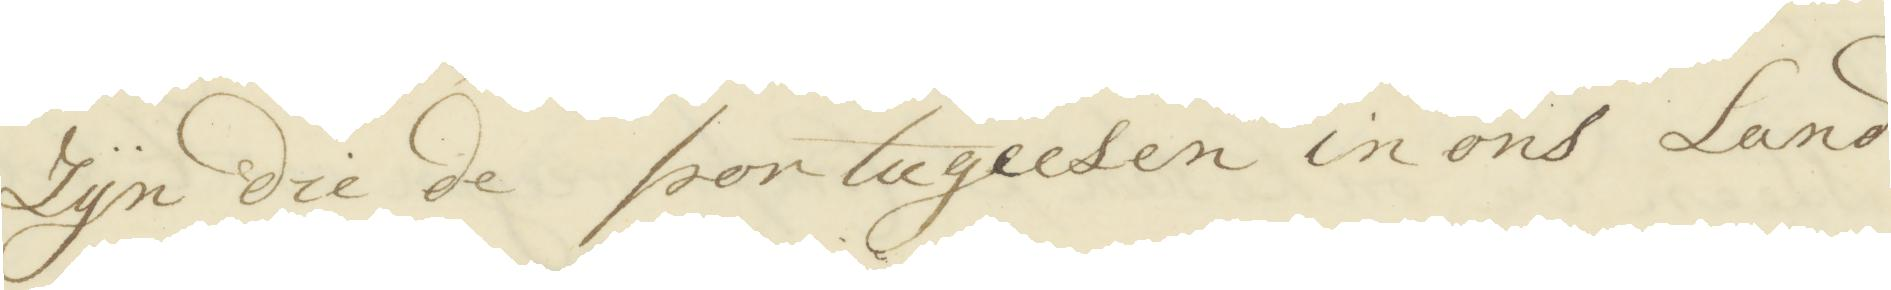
zijn die de portugeesen in ons Land
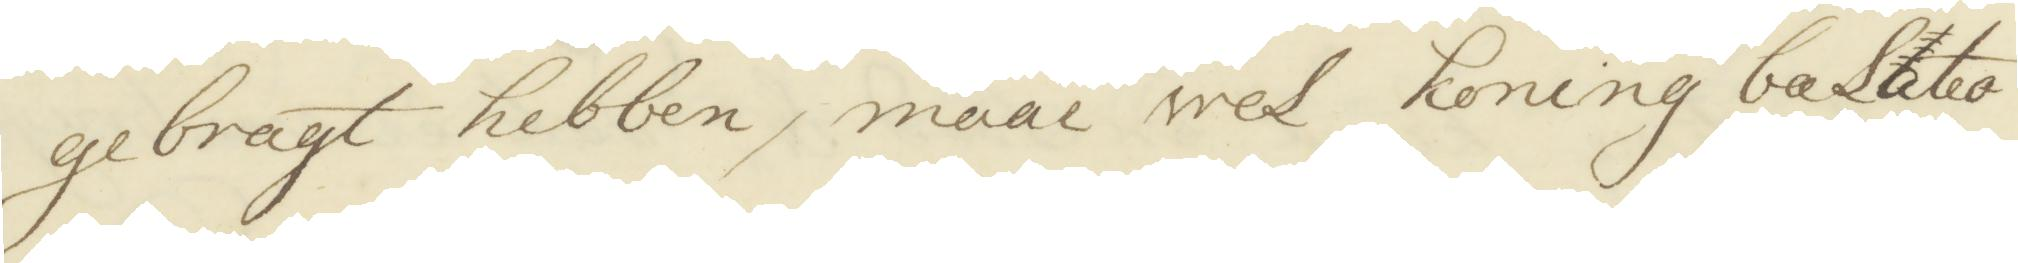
gebragt hebben, maar wel koning balateo
